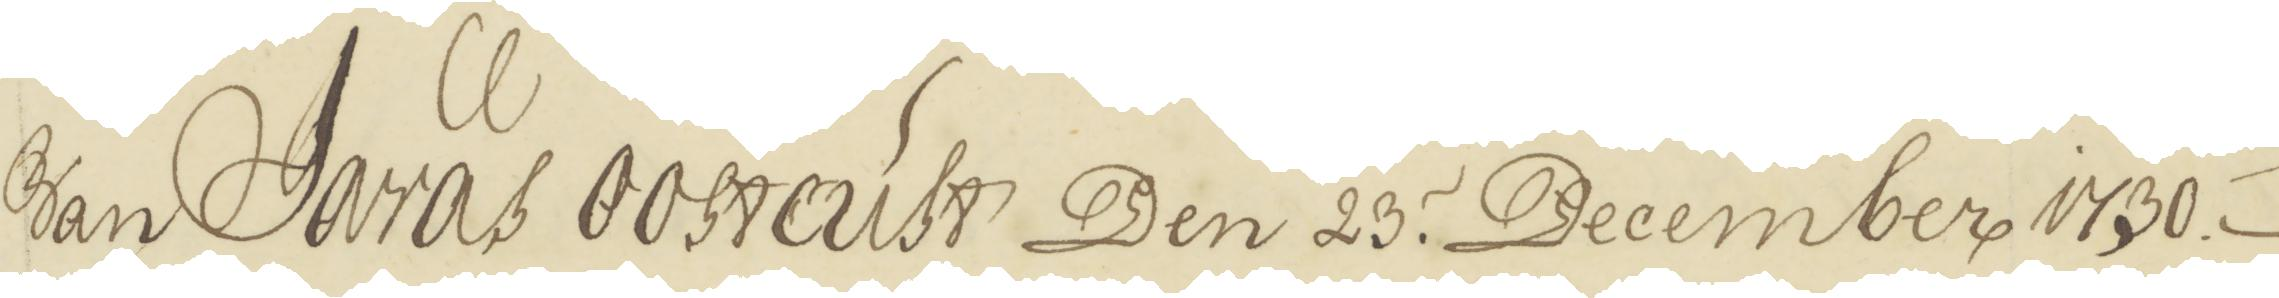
Van Javâs oostcust Den 23.' December 1730._
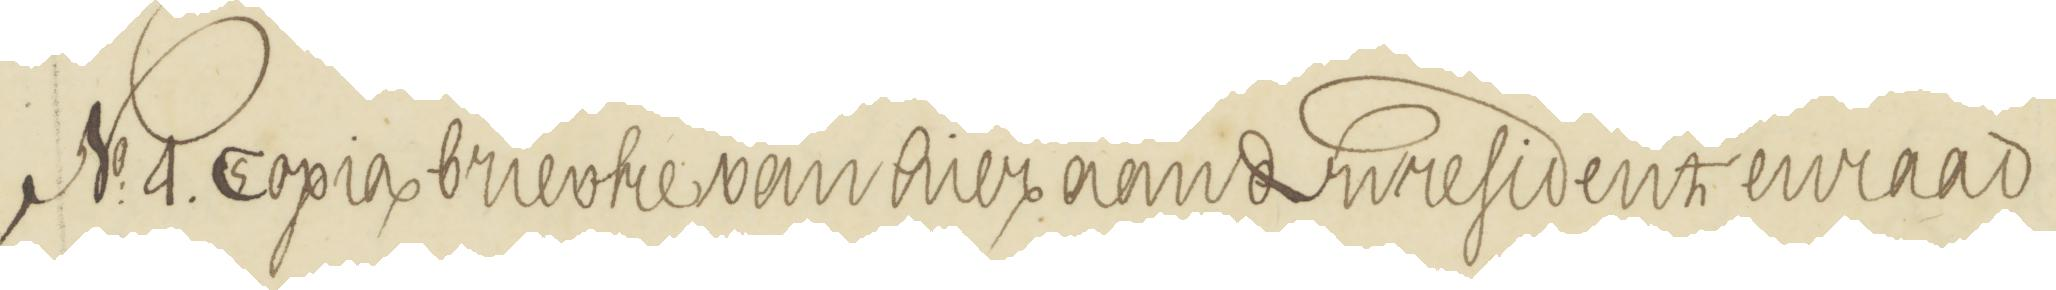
N:o 4. copia brievke van hier aan den resident en raad
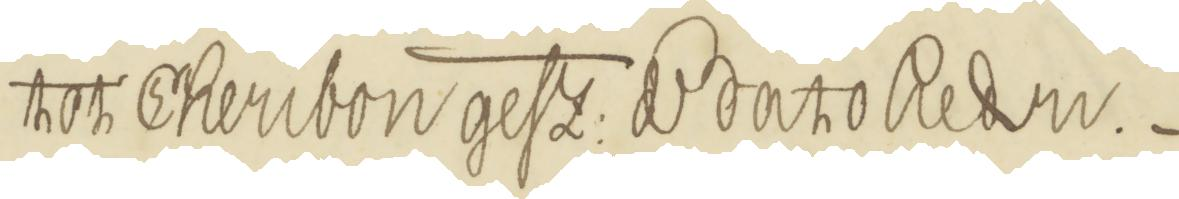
tot Cheribon gesz: de dato heden._
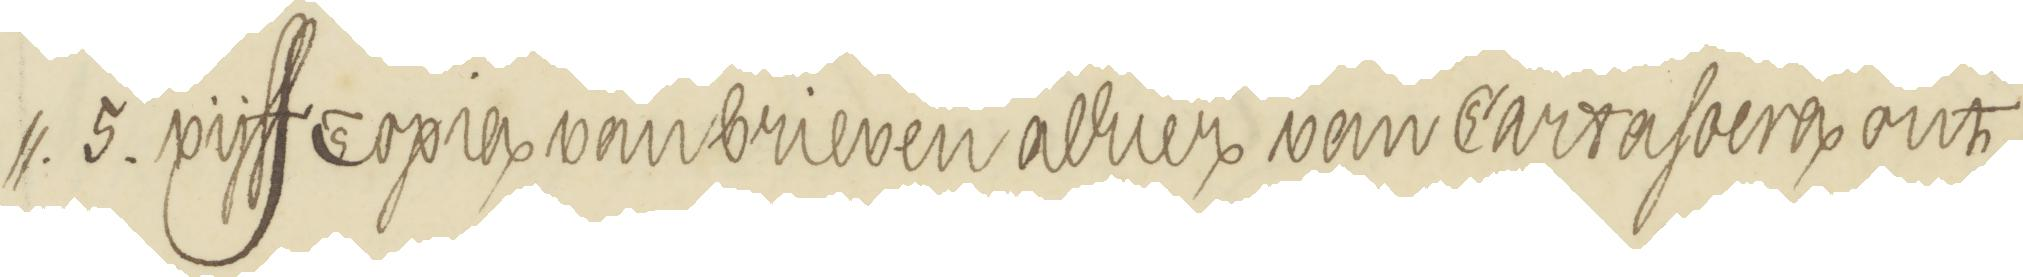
„. 5. vijff copia van brieven alhier van Cartasoera ont
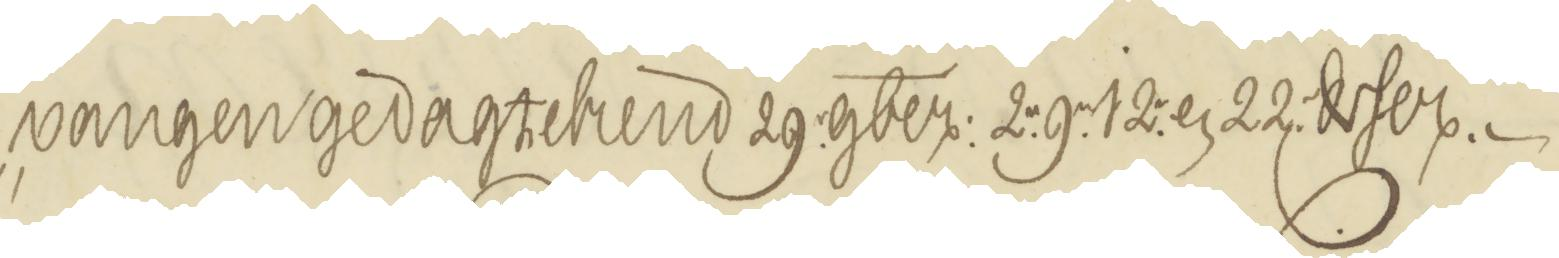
„vangen gedagtekend 29: 9ber: 2: 9: 12: en 22: deser._
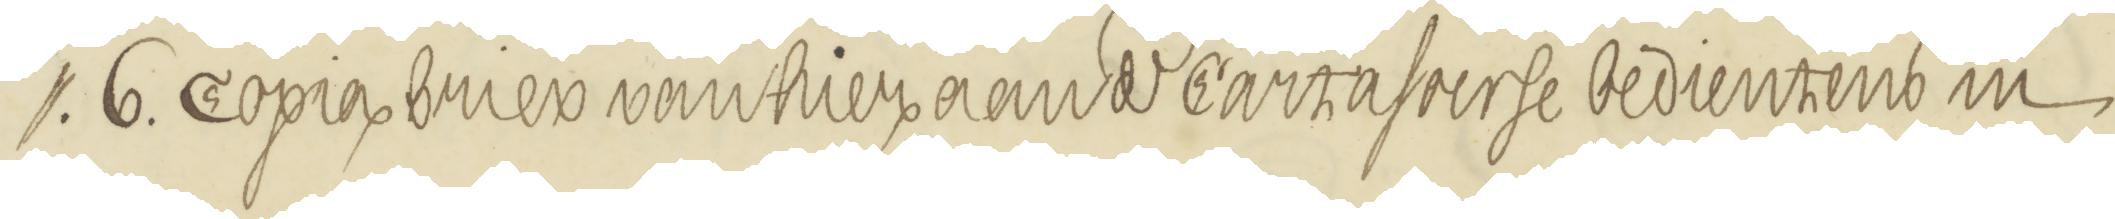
. 6. copia briev van hier aan de Cartasoerse bedientens in
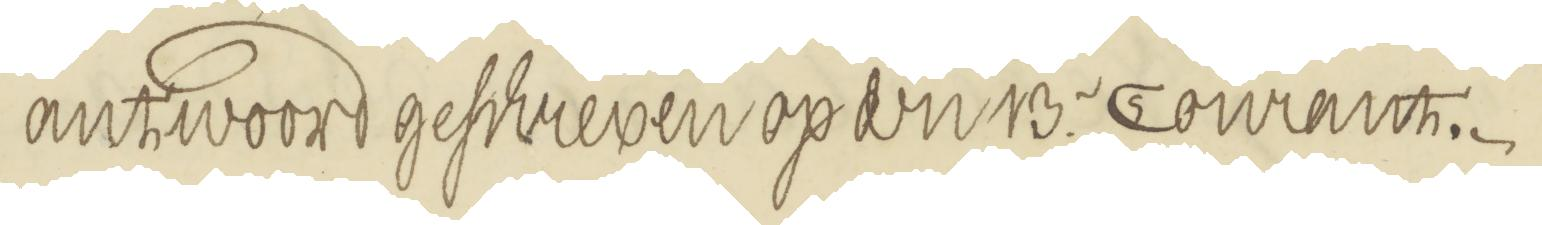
antwoord geschreven op den 13.' courant._
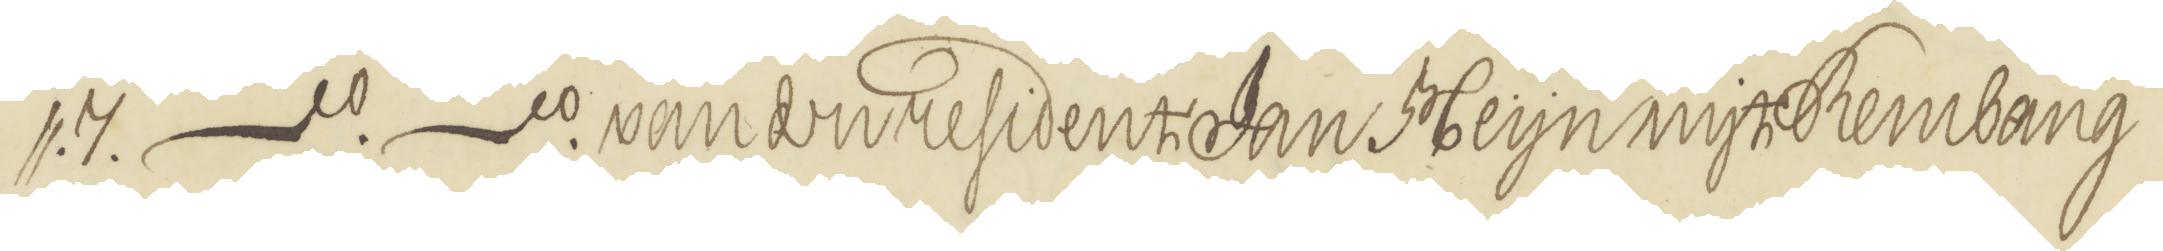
„. 7. _o. _o. van den resident Jan Heijn uijt Rembang
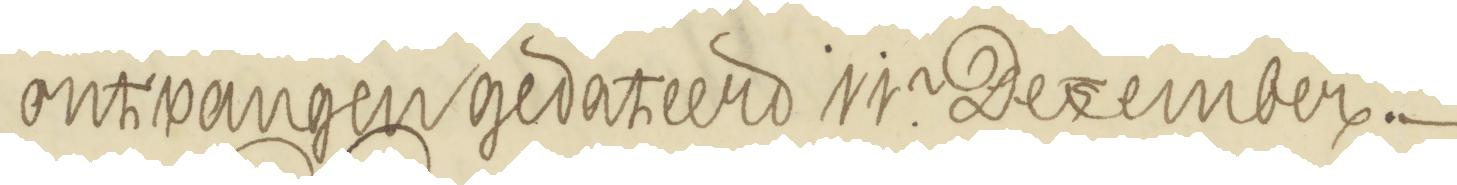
ontvangen gedateerd 11:' December. _
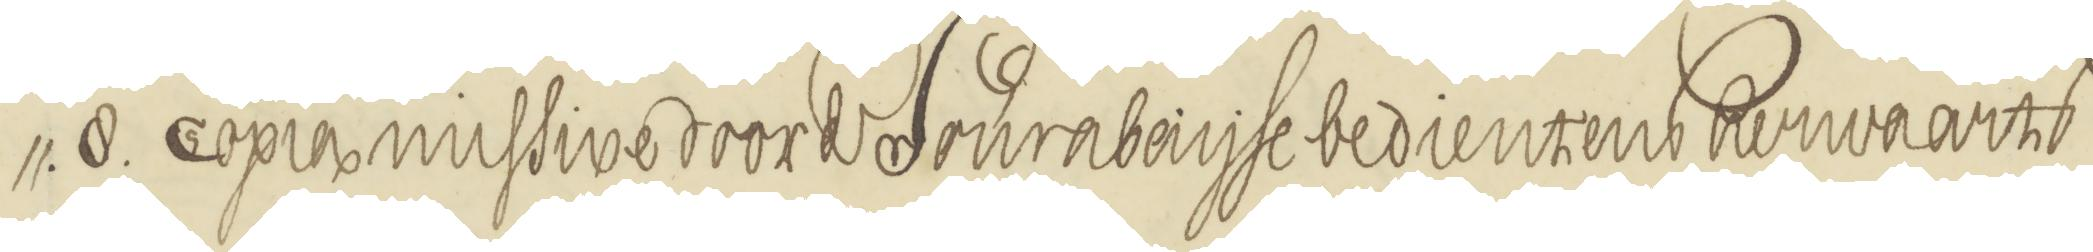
„. 8. copia missive door de Sourabaijse bedientens herwaarts
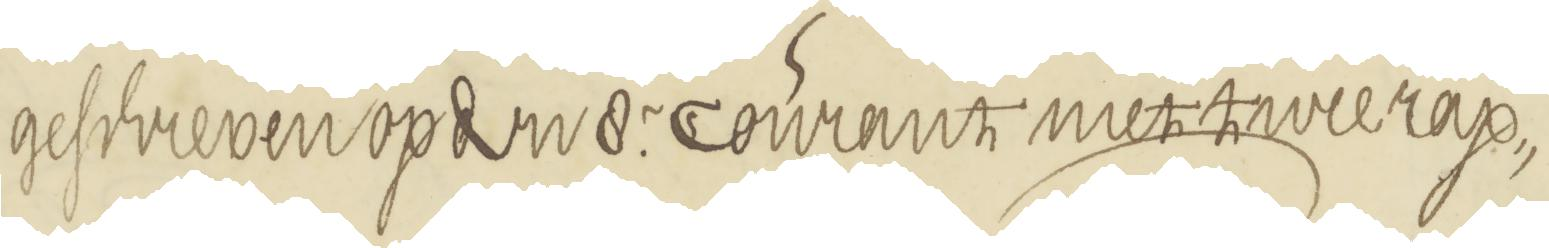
geschreven op den 8:' courant met twee rap„
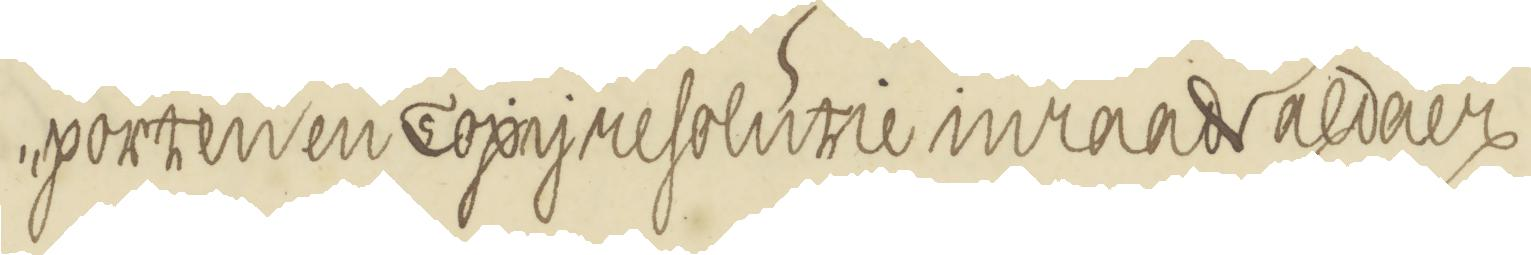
„porten en copij resolutie in raade aldaer
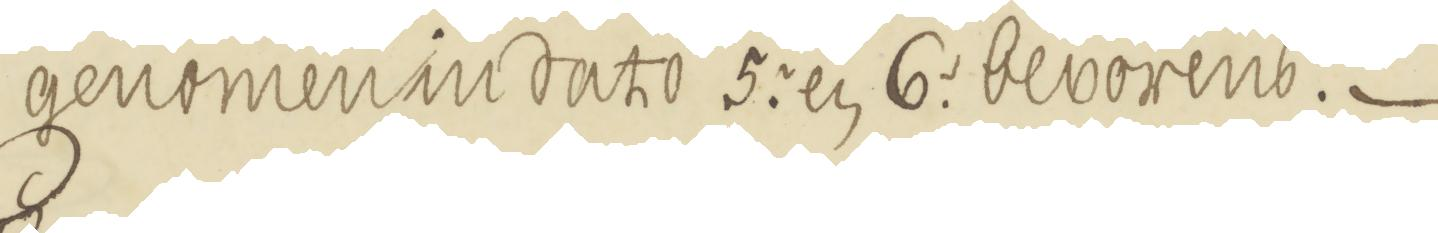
genomen in dato 5.' en 6:' bevorens. _
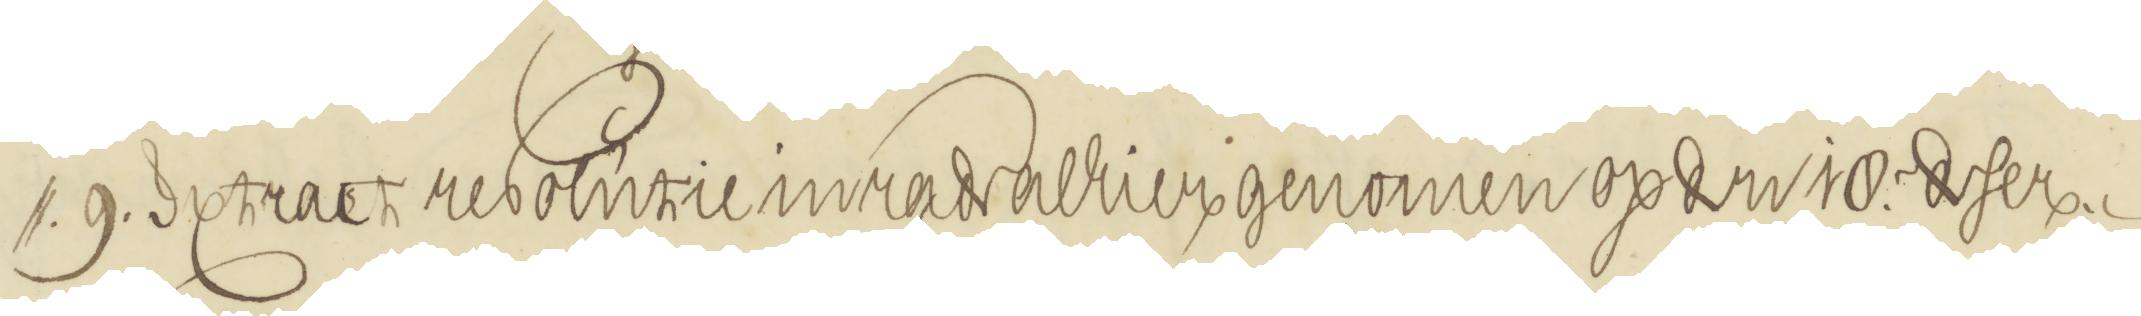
„. 9. Extract resolutie in rade alhier genomen op den 18.' deser._
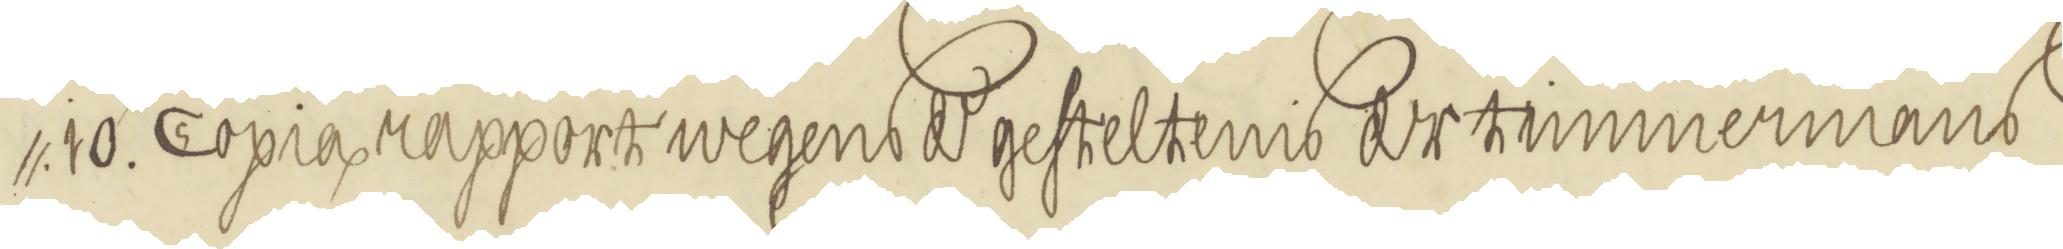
„. 10. copia rapport wegens de gesteltenis der timmermans
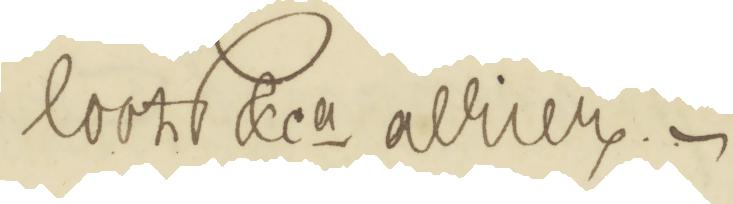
loots &c_a alhier. —
